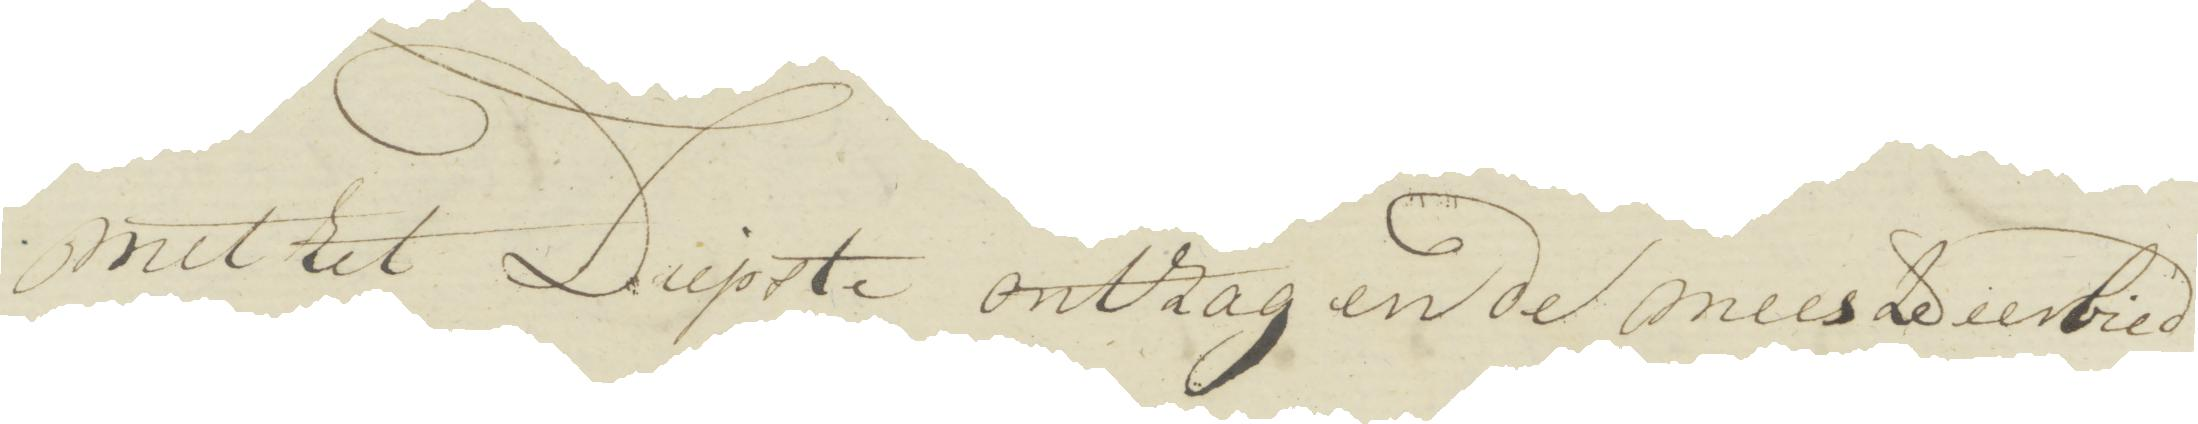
met het Diepste ontzag en de mees te eerbied
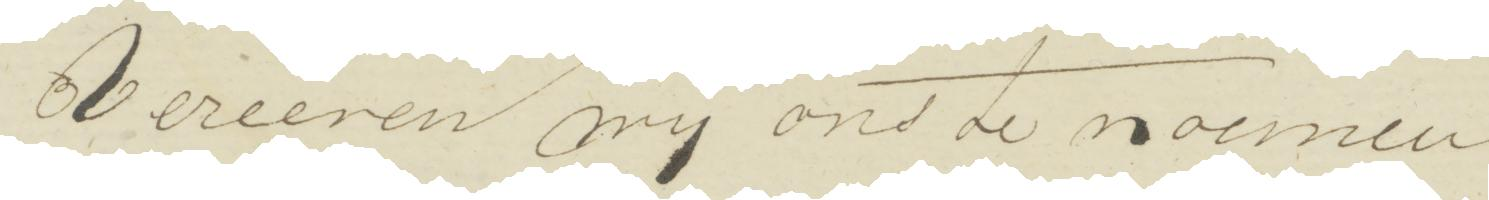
vereeren wy ons te noemen
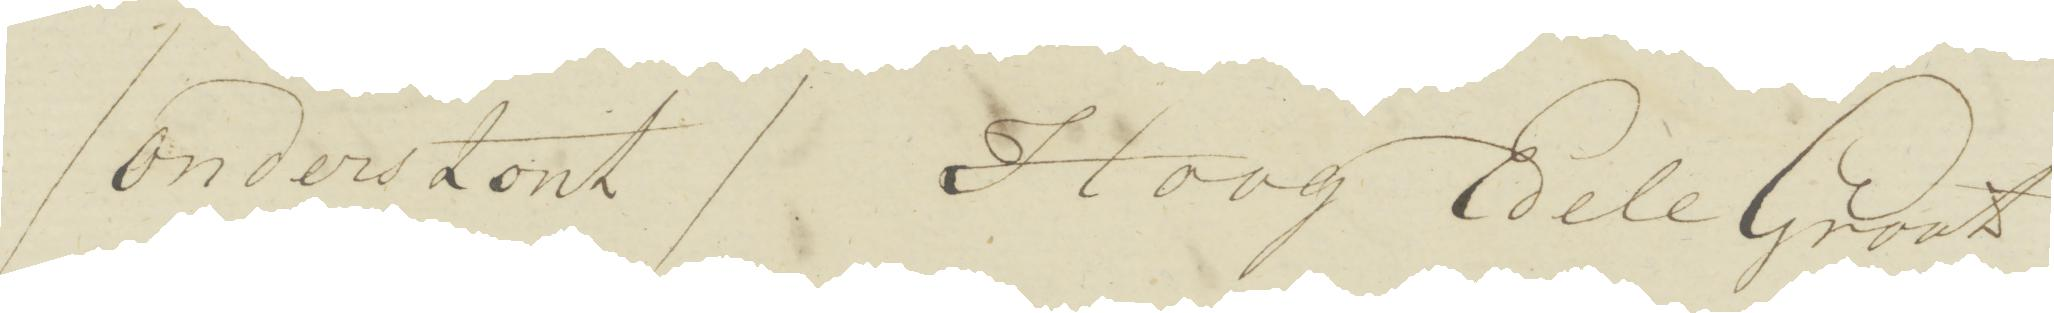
/ onder stont / Hoog Edele Groot
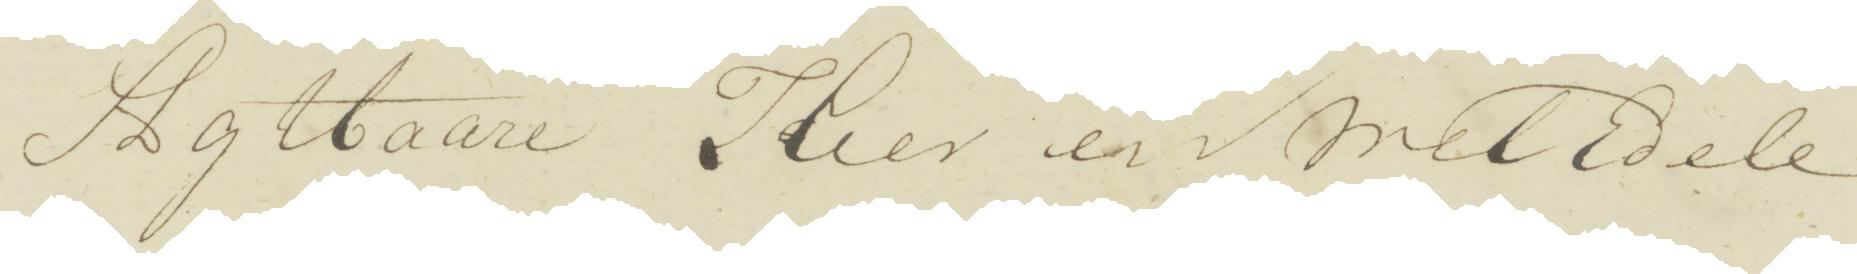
Agtbaare Heer en Wel Edele
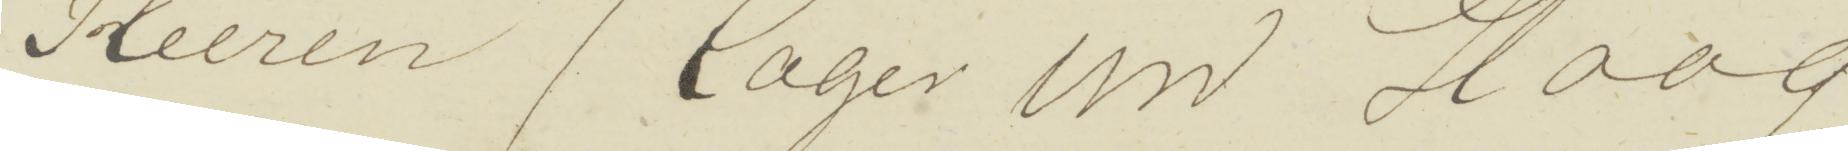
Heeren / lager uw Hoog
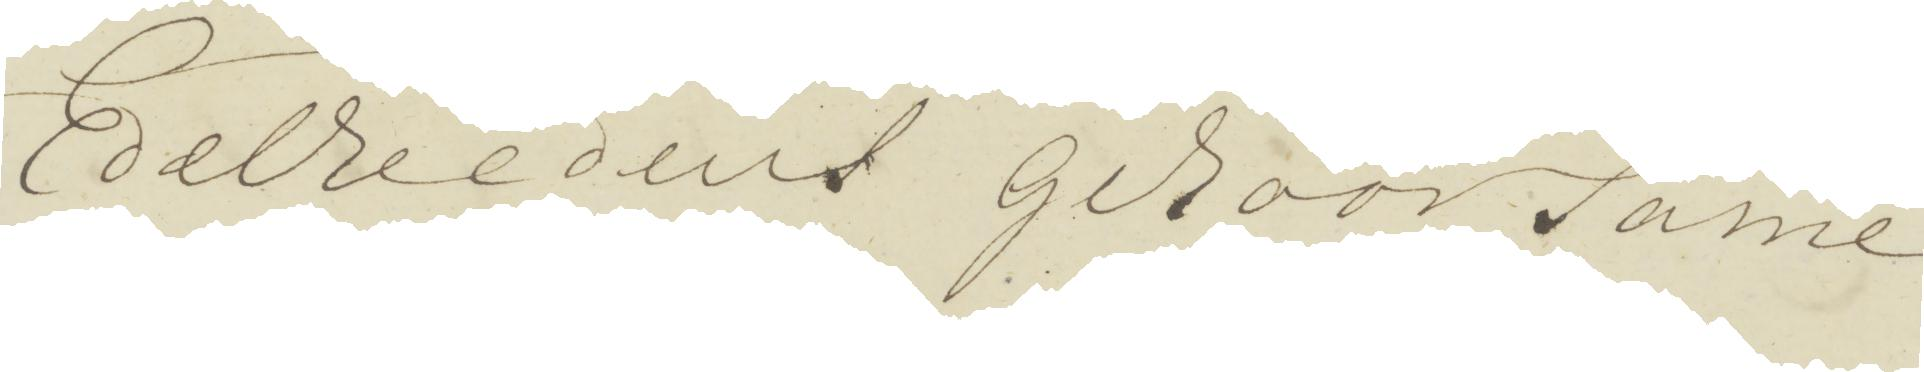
Edelheedens gehoorsame
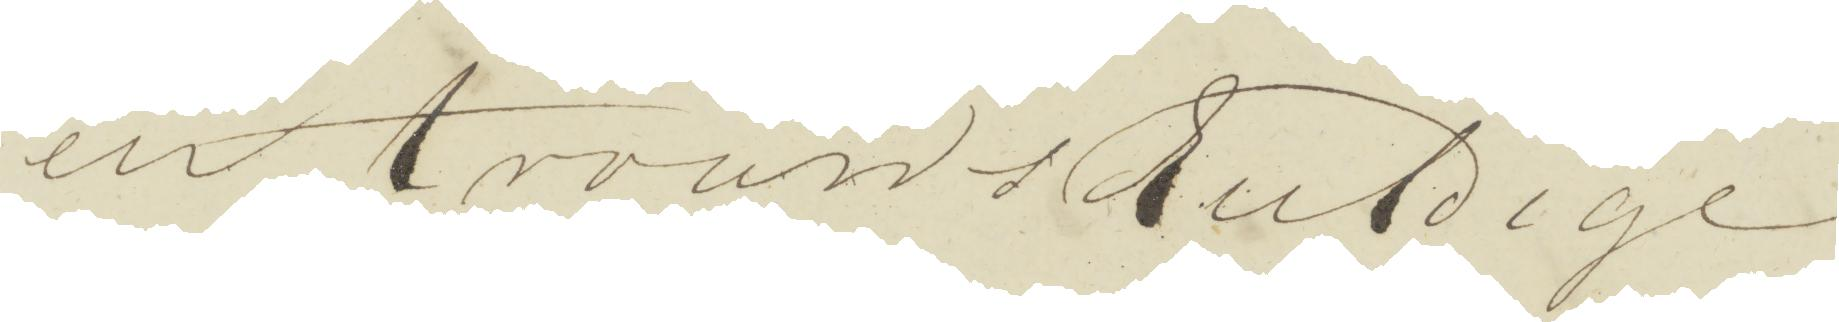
en trouwschuldige
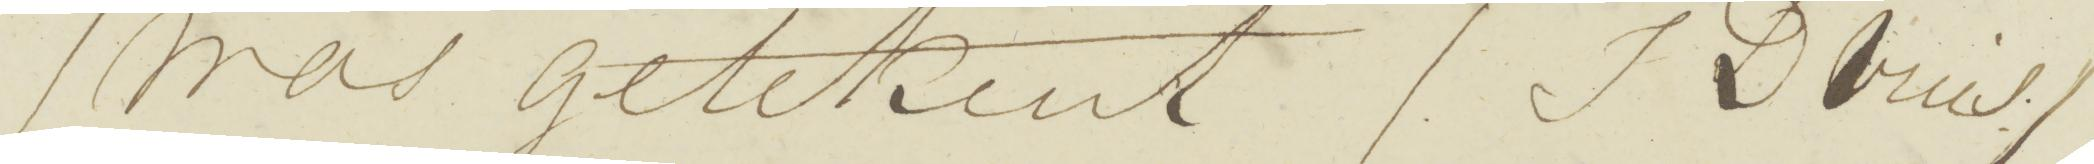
/was getekent / I D vuis:/
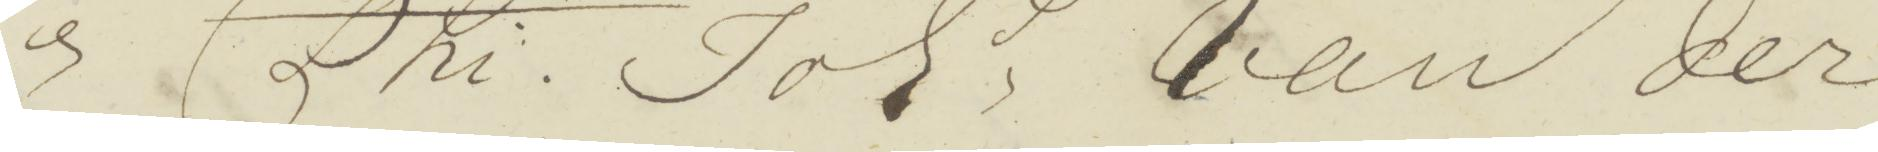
en Phi. Joh„s van der
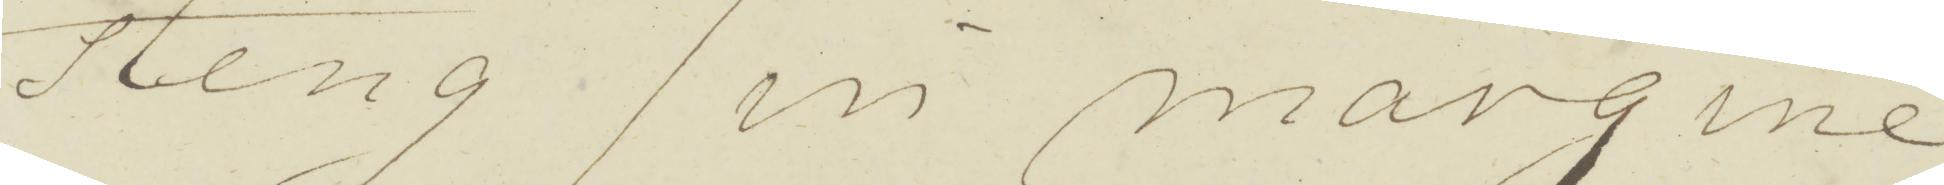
steng / in margine
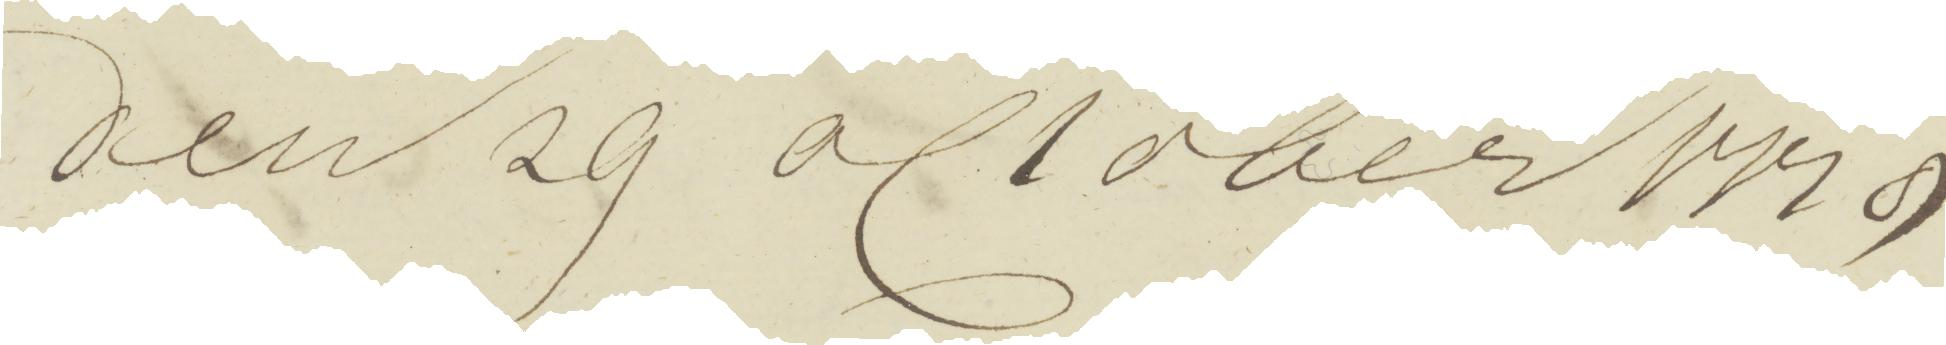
den 29 october 1778
